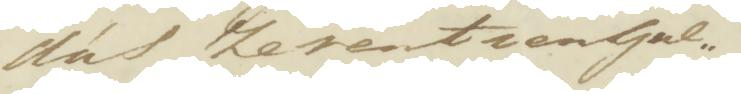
dus Zeventien Gul„
